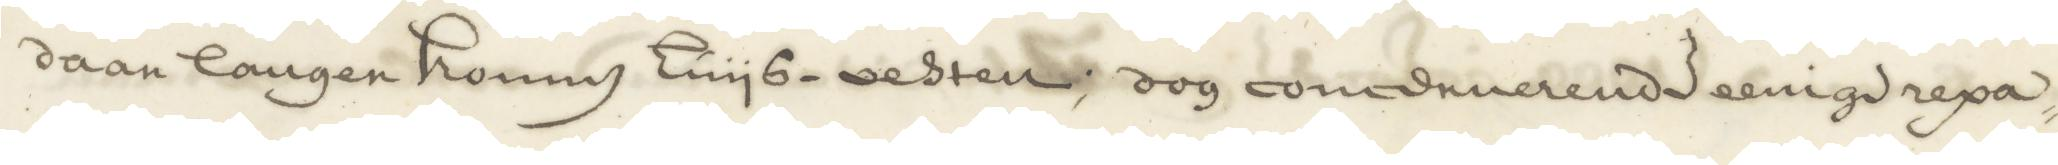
daar langer konnen huijs-vesten, dog concernerende eenige repa„
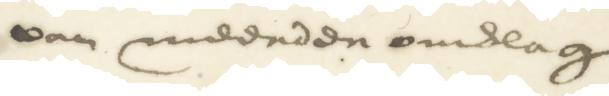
van meerder omslag
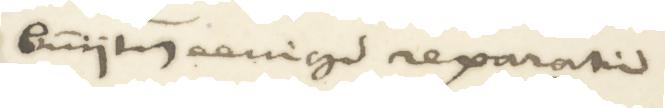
buijten eenige reparatie
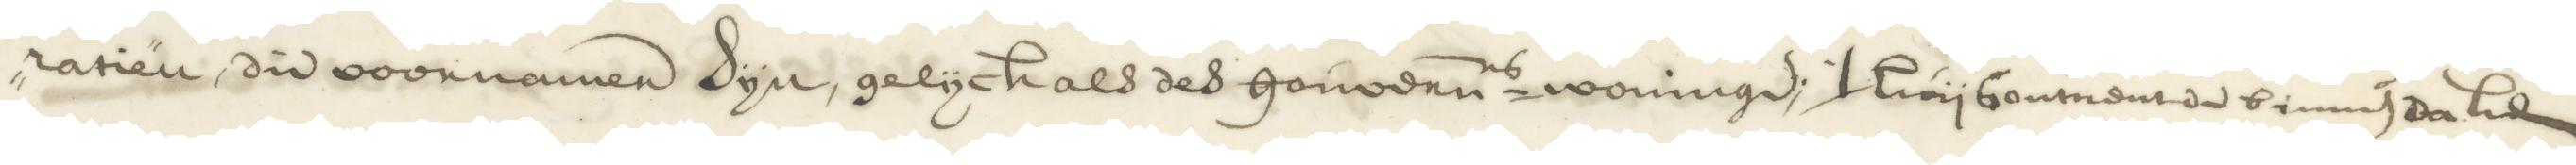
„ratien, die voornamer Sijn, gelijck als des gouvern=r woninge, ’t huijs ontrent de binnen dake
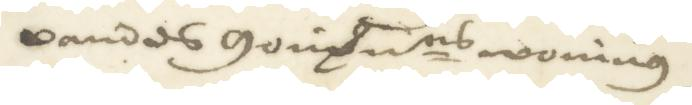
van des gouvern=rs woning
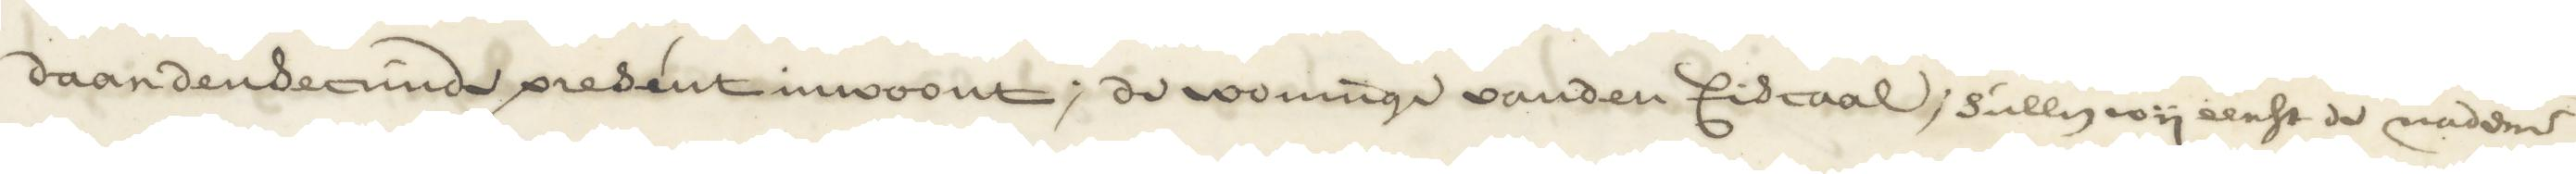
daar den Secunde present inwoont; de woninge van den fiscaal; sullen wij eerst de nadere
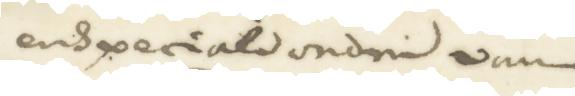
en speciale ordre van
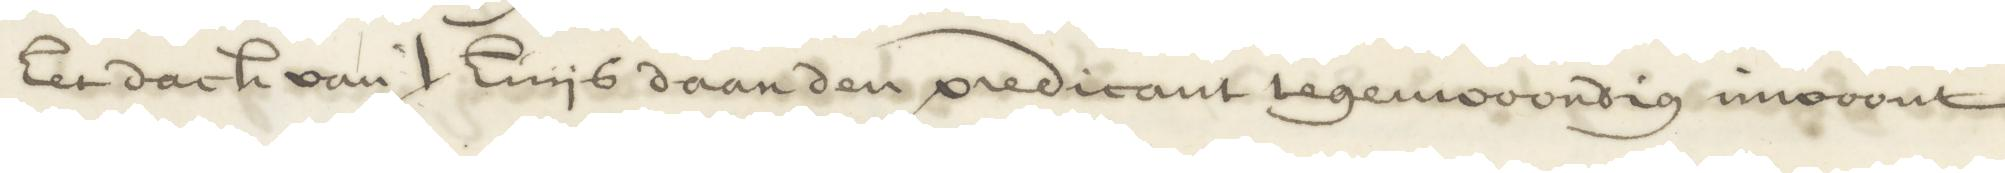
het dack van ’t huijs daar den predicant tegenwoordig inwoont
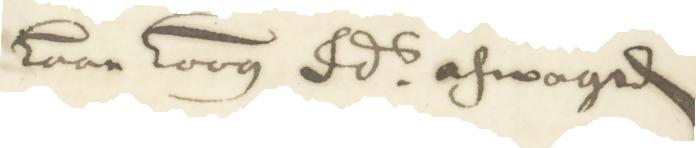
haar hoog Ed.s afwagten
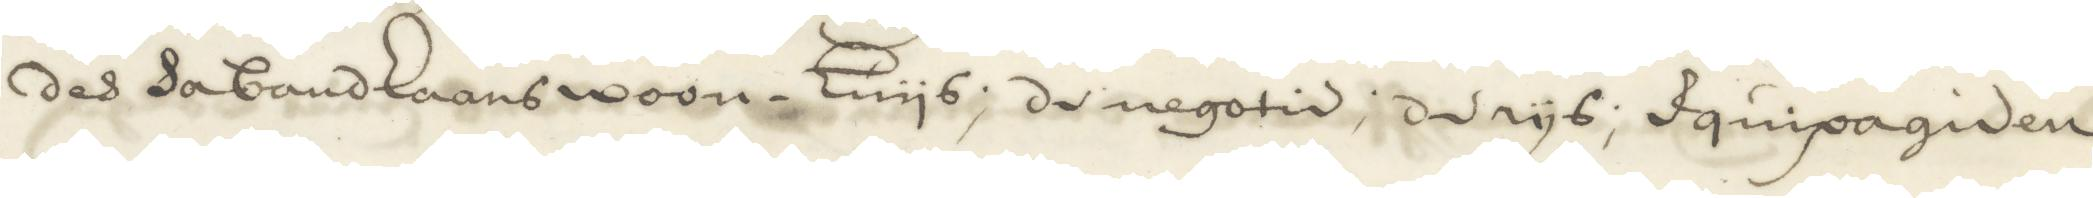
des sabandhaars woon-huijs; de negotie; de rijs; Equipagieen
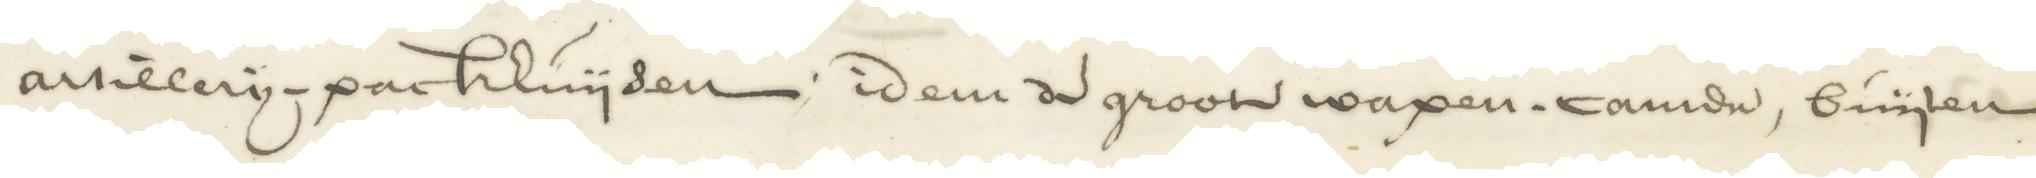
artillerij- packhuijsen; idem de groote wapen-camer, buijten
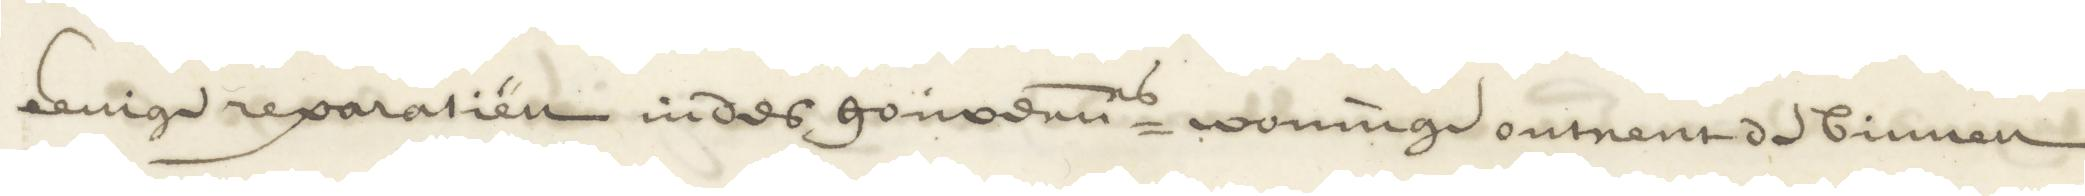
eenige reparatiën in des gouvern=rs woninge ontrent de binnen
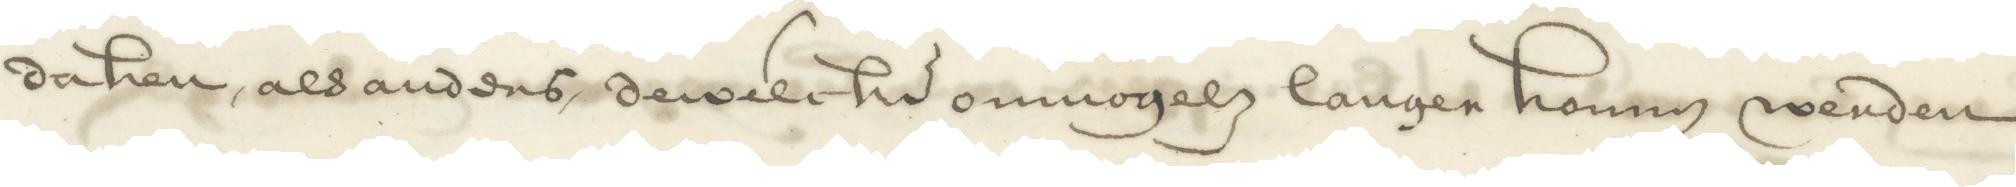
daken, als anders dewelcke onmogelijk langer konnen werden
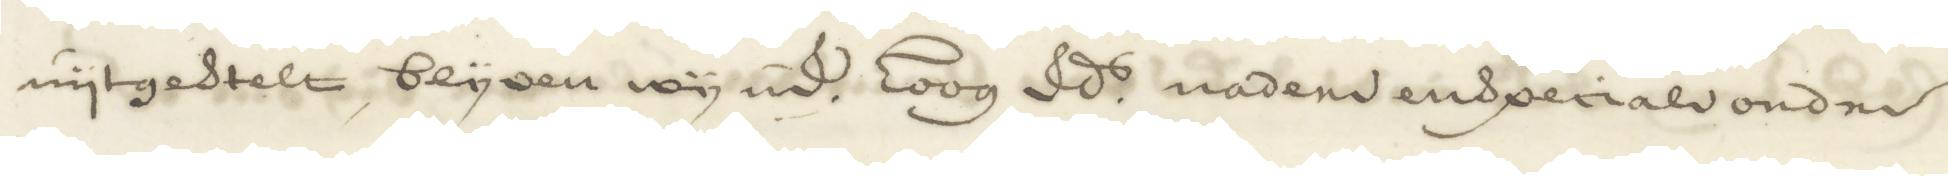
uijtgestelt blijven wij uE. hoog Ed.s nadere en speciale ordre
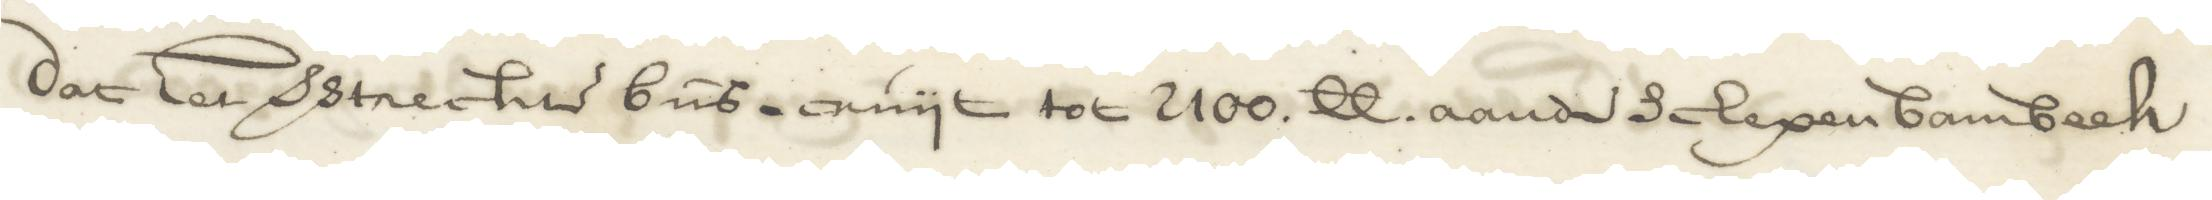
dat het verstreckte bus-cruijt tot 2100. ll. aande schepen bambeek
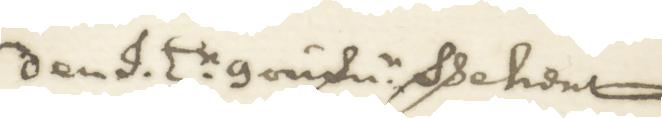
den S. E:e gouvern:r versekert
